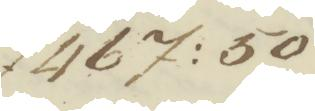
ƒ467: 50
